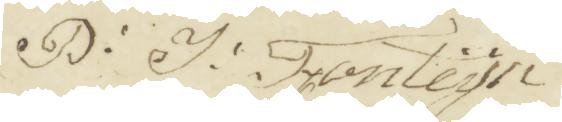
P: I: Fonteijn
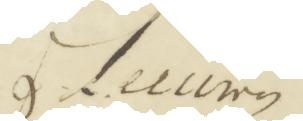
J v Leeuwen
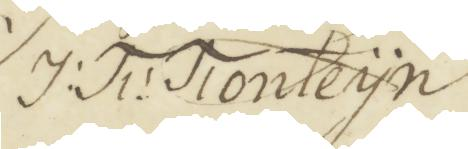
I: F: Fonteijn
